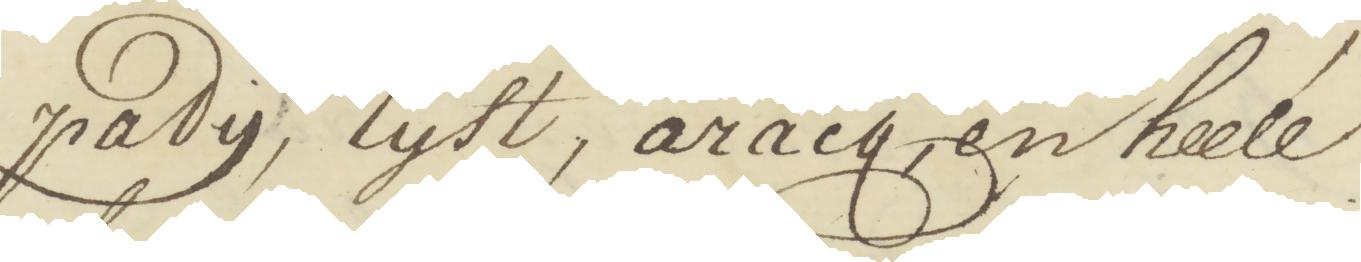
padij, rijst, aracq, en heele
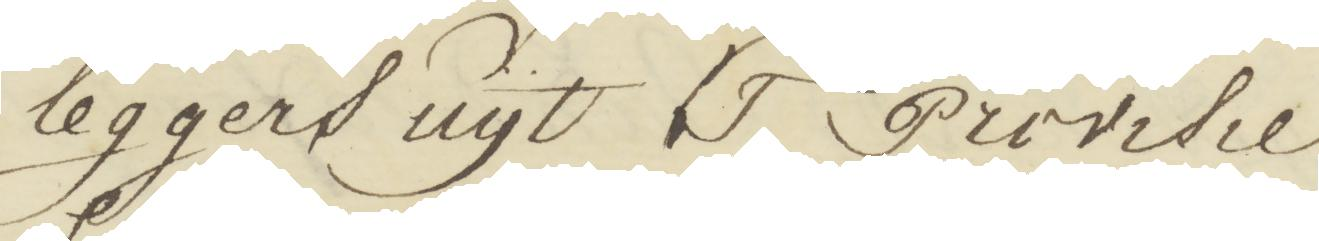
leggers uijt 'T provisie
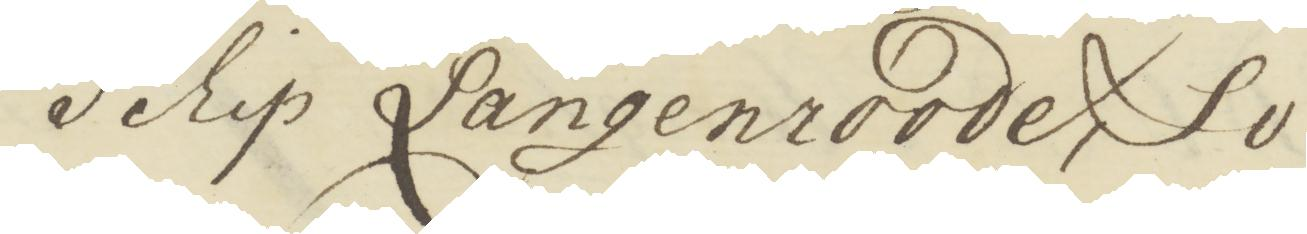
schip Langenroode, so
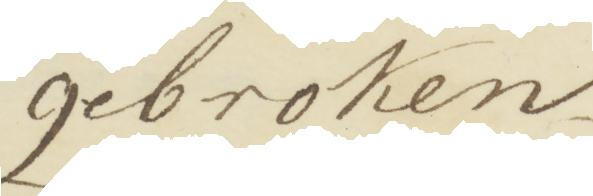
gebroken
